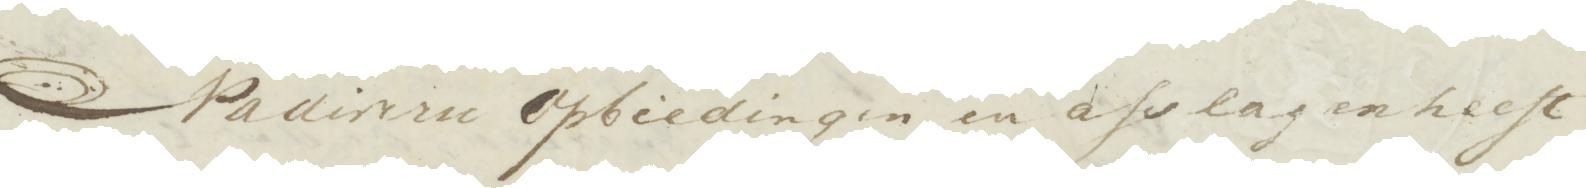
Na diverse opbiedingen en afslagen heeft
